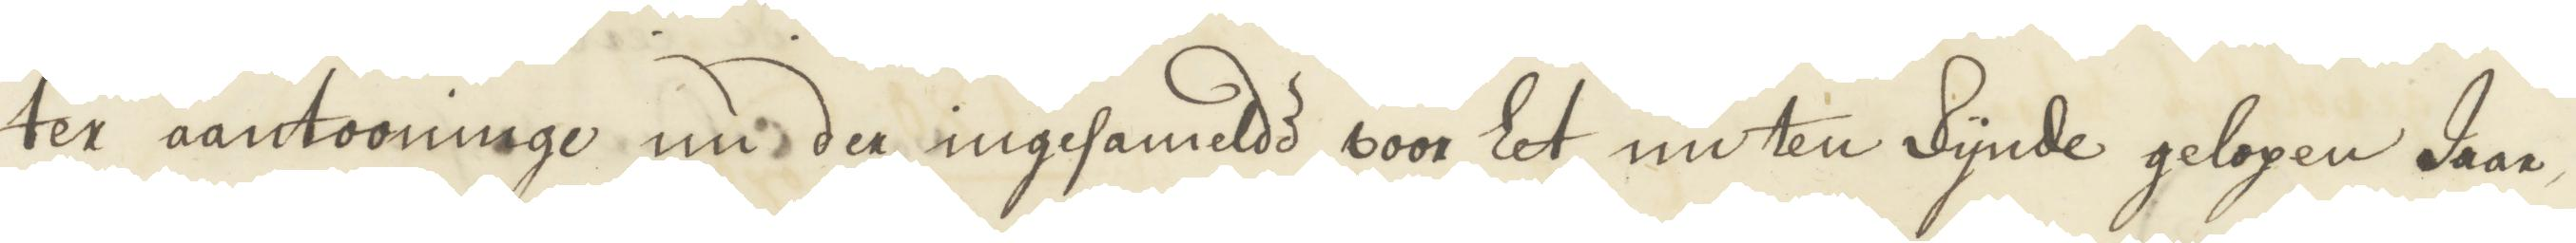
ter aantooninge nu der ingesamelde voor het nu ten Eijnde gelopen Iaar,
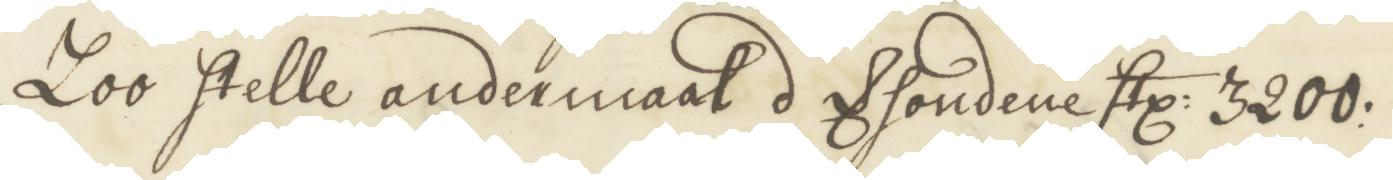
zoo stelle andermaal d versondene stx: 3200:
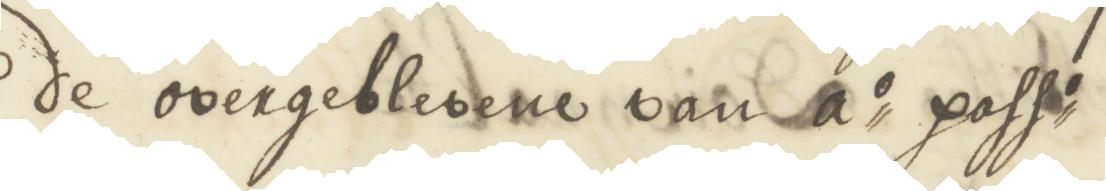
de overgeblevene van a„o pass„o
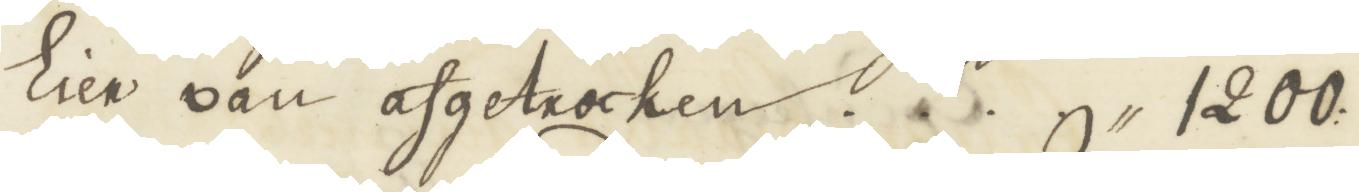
hier van afgetrocken - - - - „ 1200:
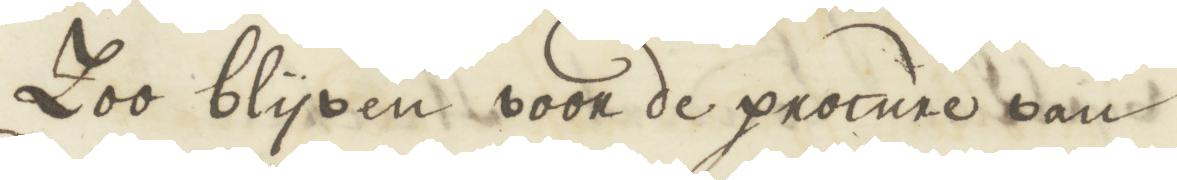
Zoo blijven voor de procure van
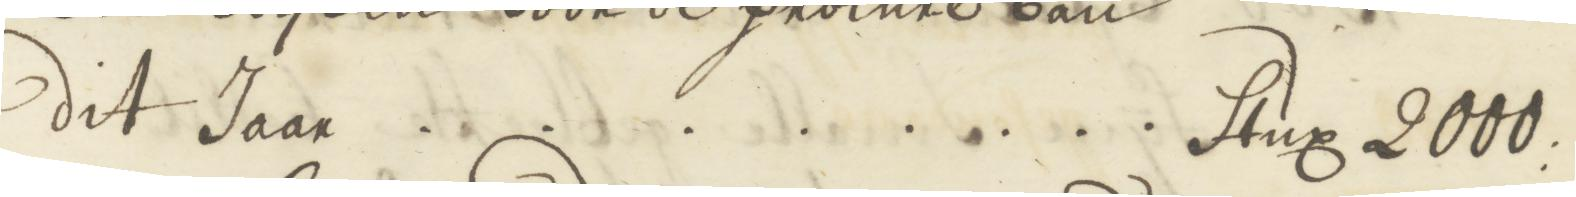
dit Iaar - - - - - - - - Stux 2000:
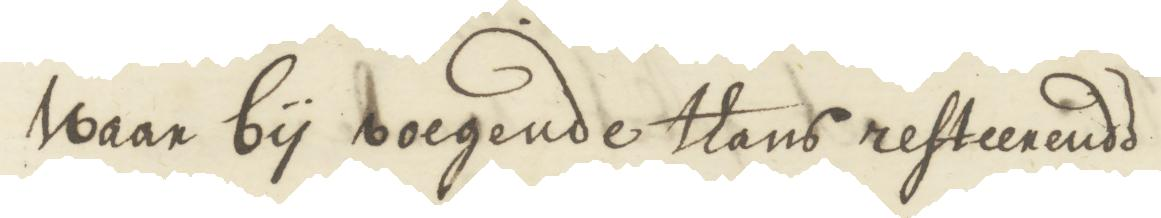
waar bij voegende thans resteerende
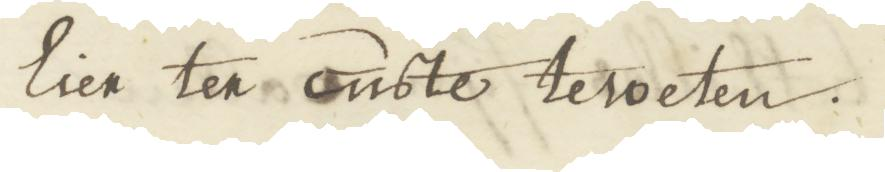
hier ter custe teweten.
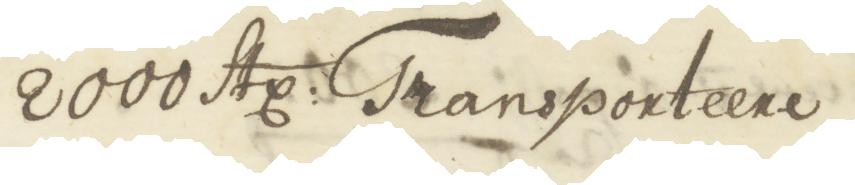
2000 stx: Transporteere
